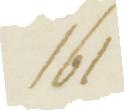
161
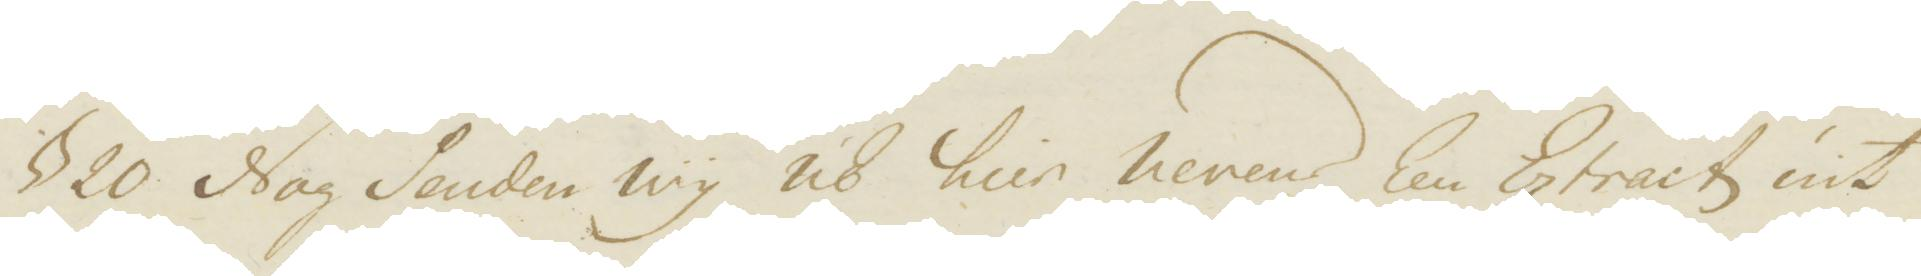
§ 20 Nog senden wij uE hier nevens Een Extract uit
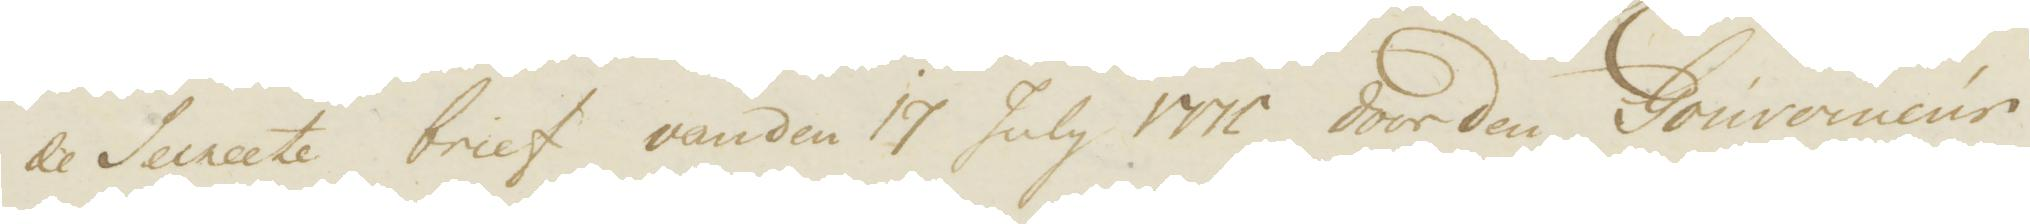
de Secreete brief vanden 17 July 1775 door den Gouverneur
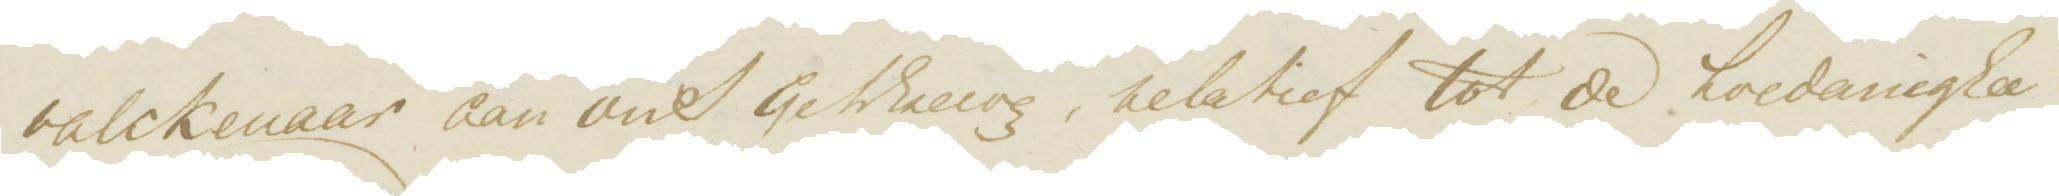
valckenaar aan ons geschreeven , relatief tot de hoedanighee
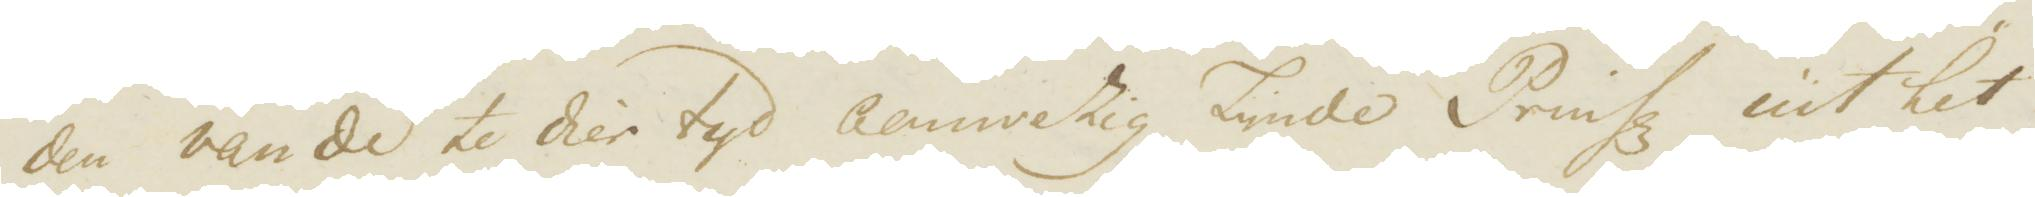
den van de te dier tyd aanwezig zijnde Prinsen uit het
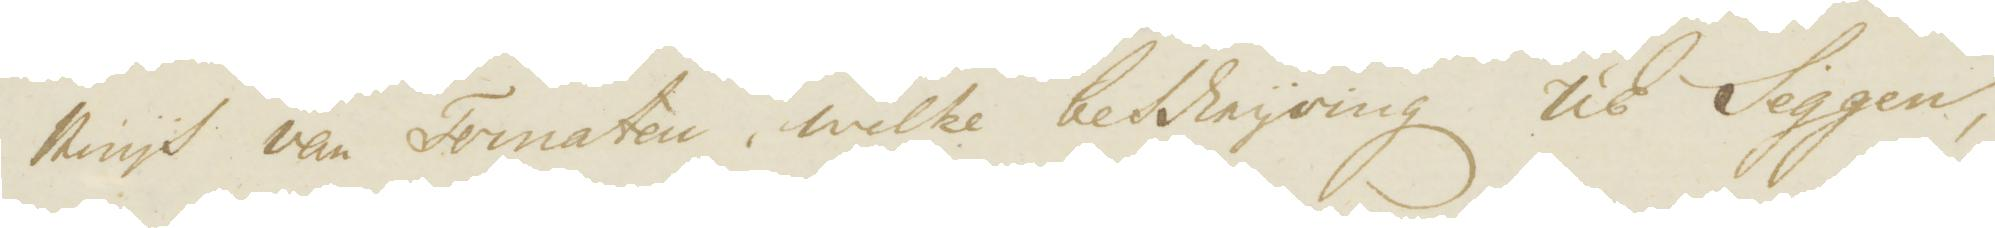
huijs van Ternaten , welke beschrijving uE seggen,
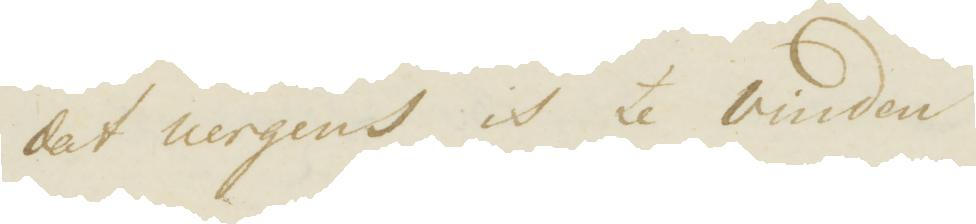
dat nergens is te vinden
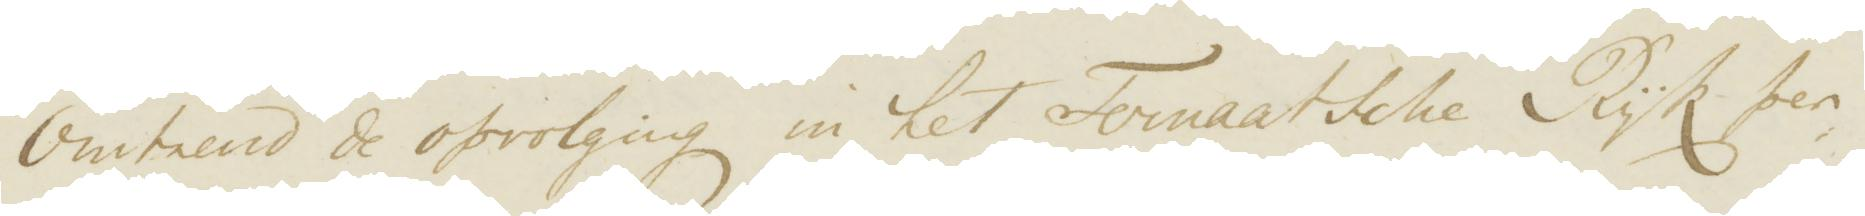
Omtrend de opvolging in het Ternaatsche Rijk per,
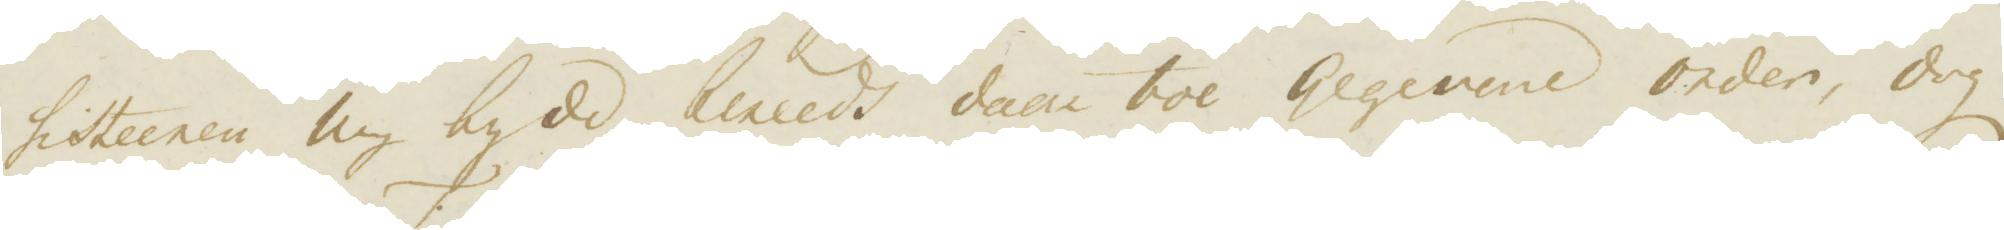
sisteeren wy by de bereeds daar toe gegevene order, dog
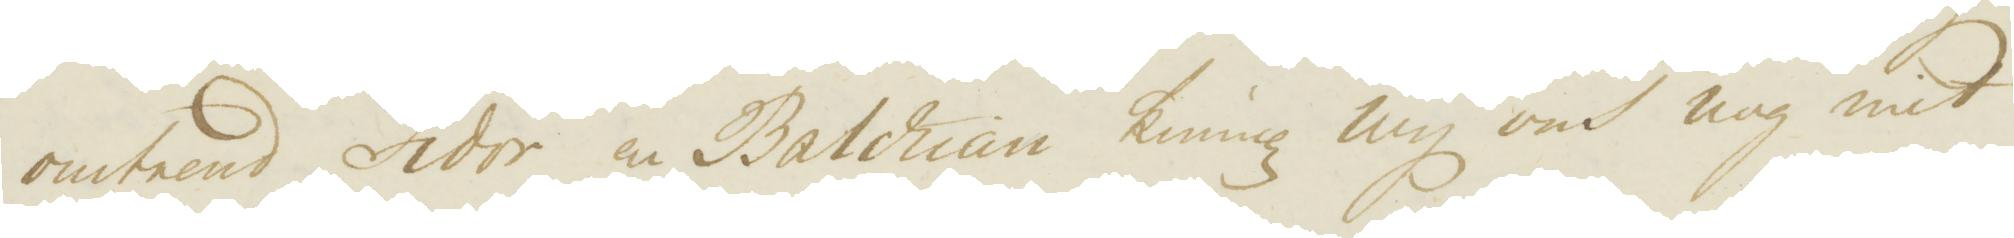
omtrend Tidor en Batchian kunnen wy ons nog niet
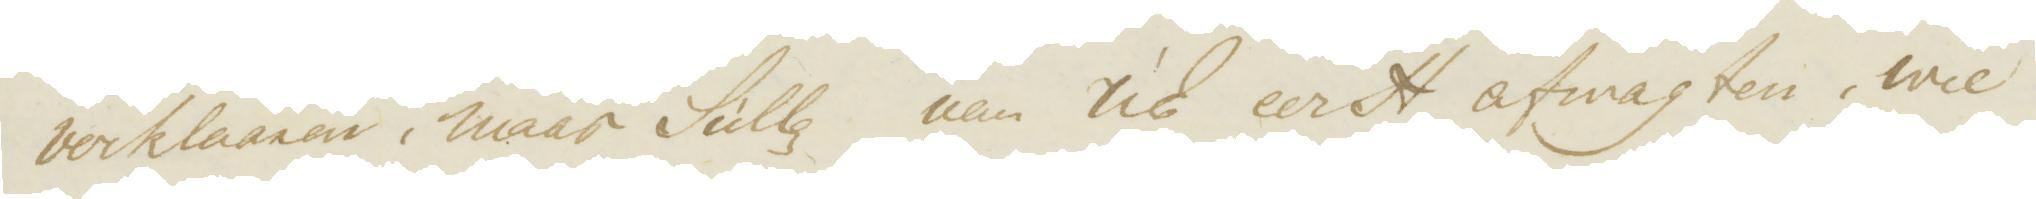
verklaaren, maar sullen van uE eerst afwagten , wie
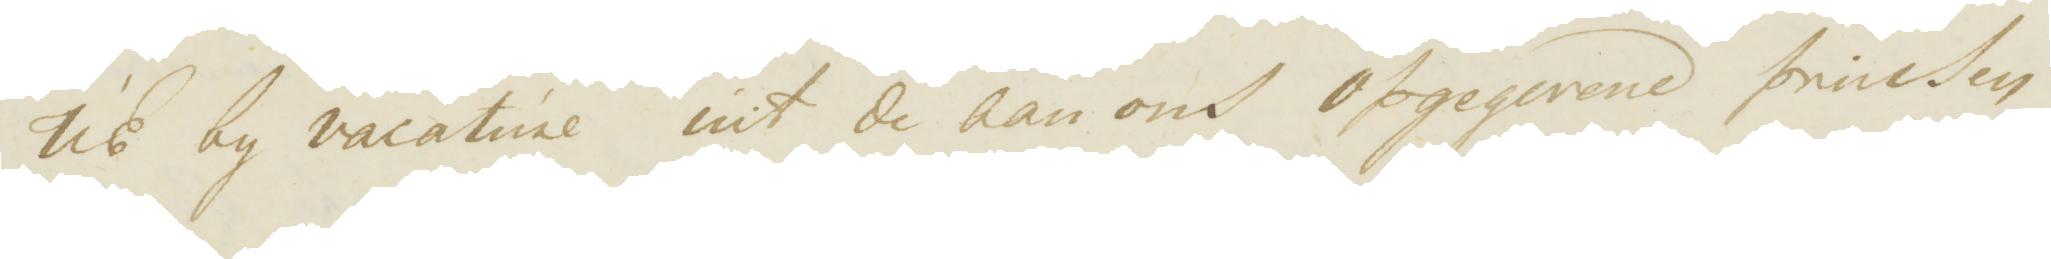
uE by vacature uit de aan ons opgegevene prinsen
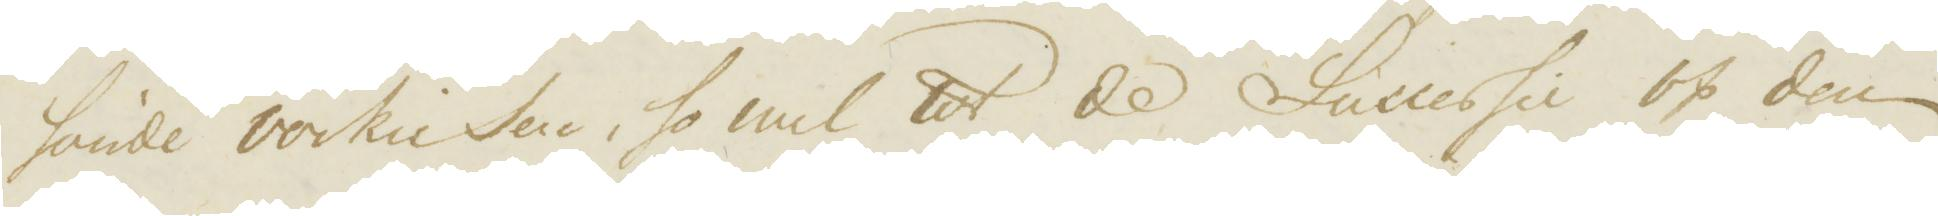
soude verkiesen, so wil tot de Successie op den
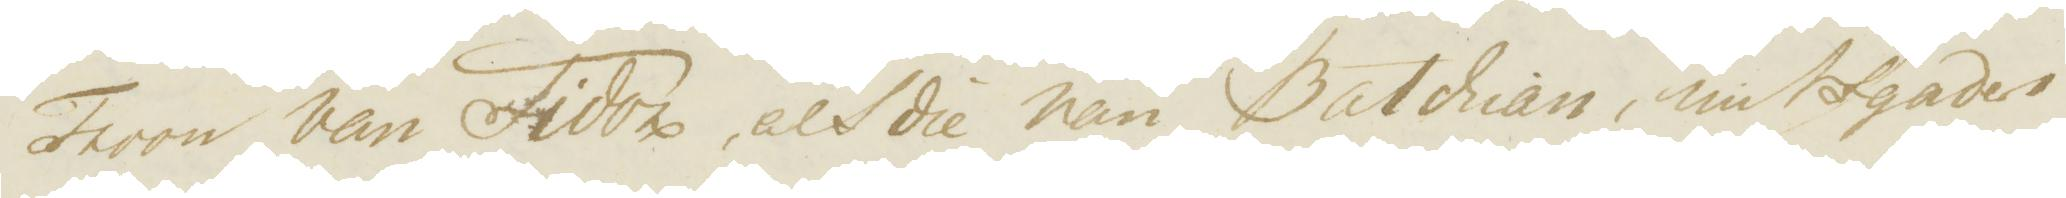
Troon van Tidor ,als die van Batchian, mitsgaders
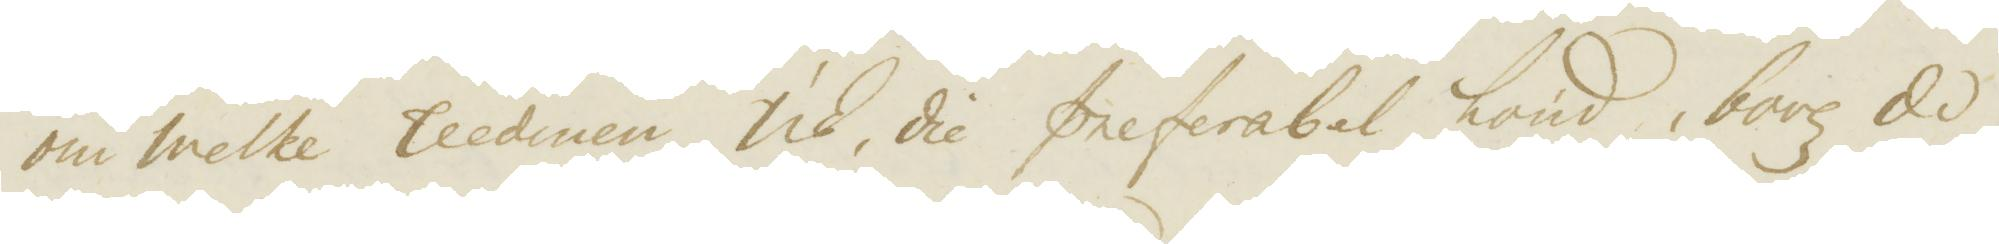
om welke reedenen uE, die preferabel houd , boven de
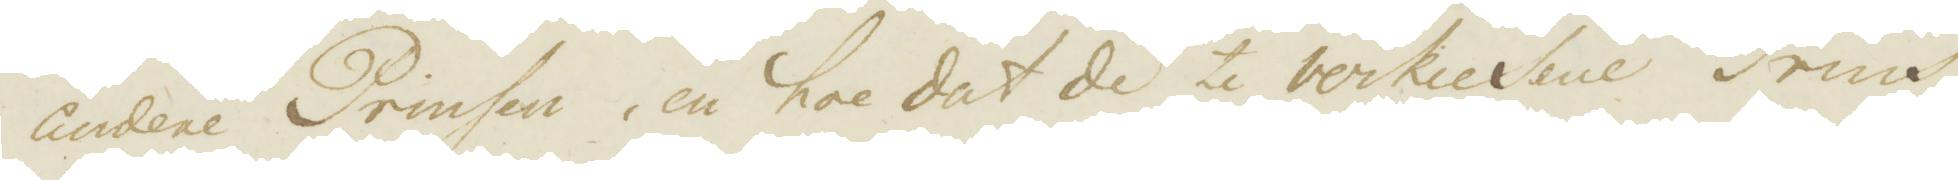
andere Prinsen , en hoe dat de te verkiesene Prins
